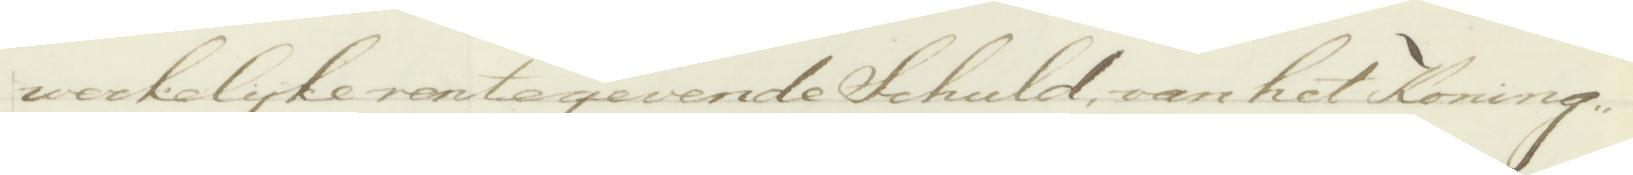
werkelijke rentegevende schuld, van het Koning„
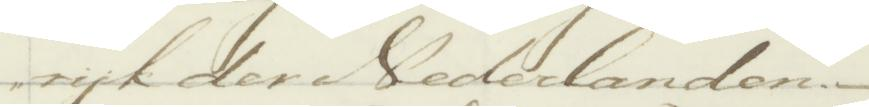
„rijk der Nederlanden. —
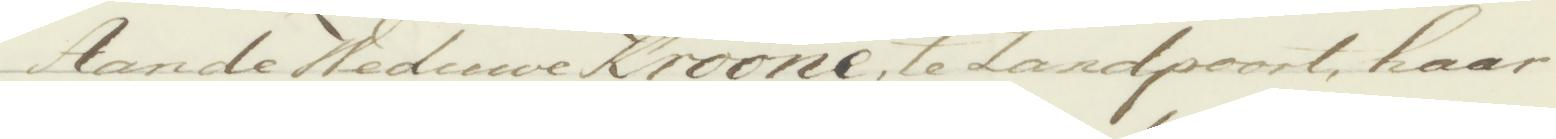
Aan de Weduwe Kroone, te Zandpoort, haar
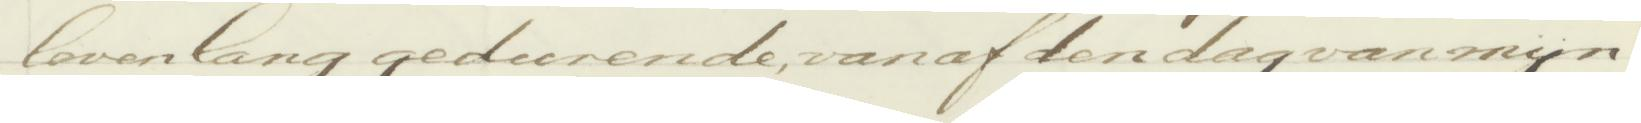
leven lang gedurende, van af den dag van mijn
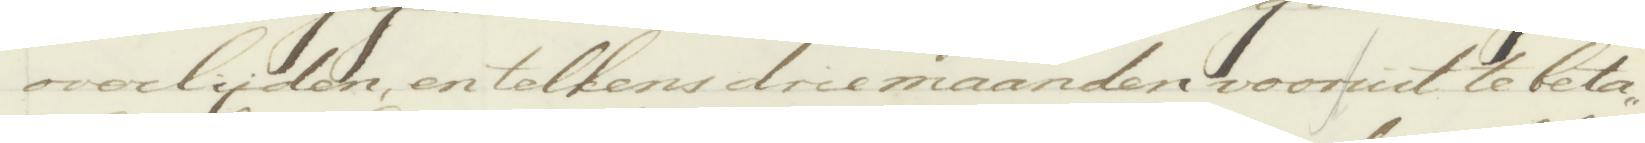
overlijden, en telkens drie maanden voor|uit te beta„
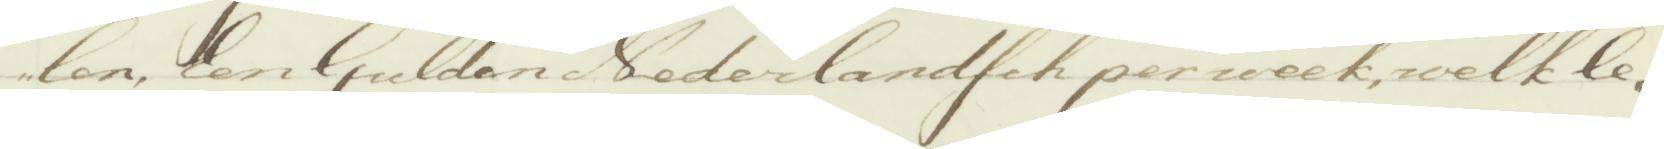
„len, Een Gulden Nederlandsch per week, welk le„
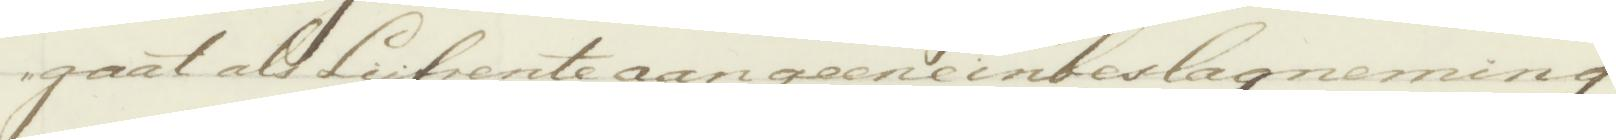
„gaat als Lijfrente aan geene inbeslagneming
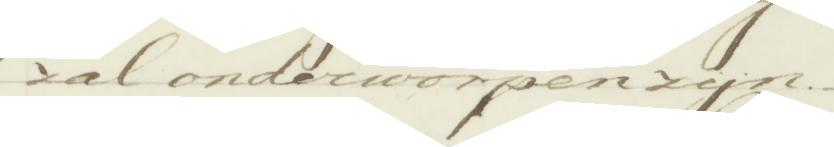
zal onderworpen zijn. —
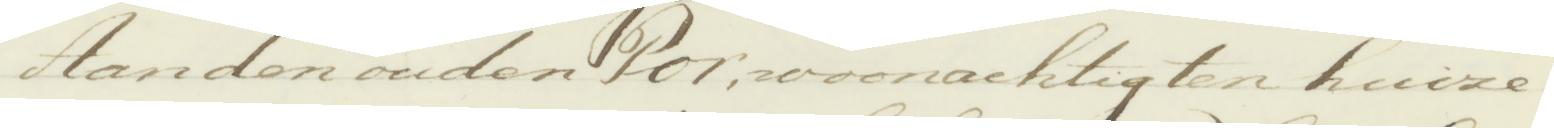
Aan den ouden Por, woonachtig ten huize
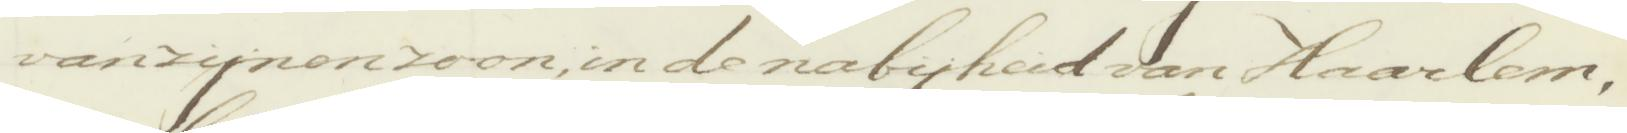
van zijnen zoon, in de nabijheid van Haarlem,
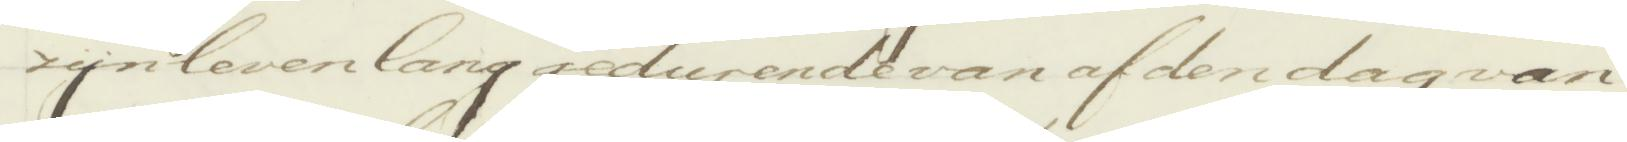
zijn leven lang gedurende van af den dag van
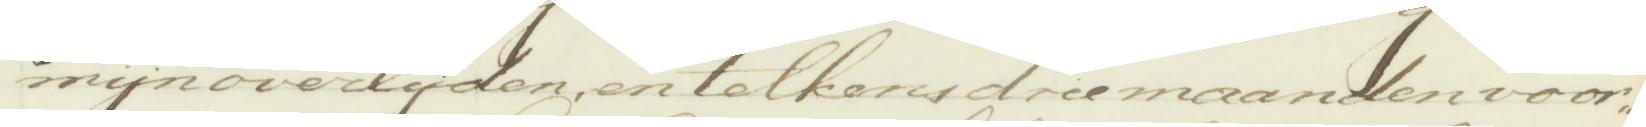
mijn overlijden, en telkens drie maanden voor„
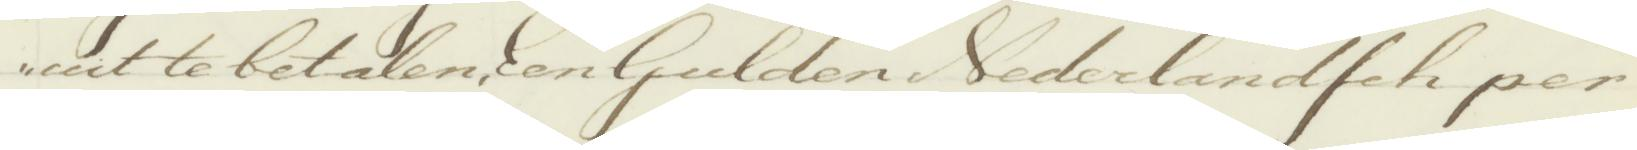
„uit te betalen, Een Gulden Nederlandsch per
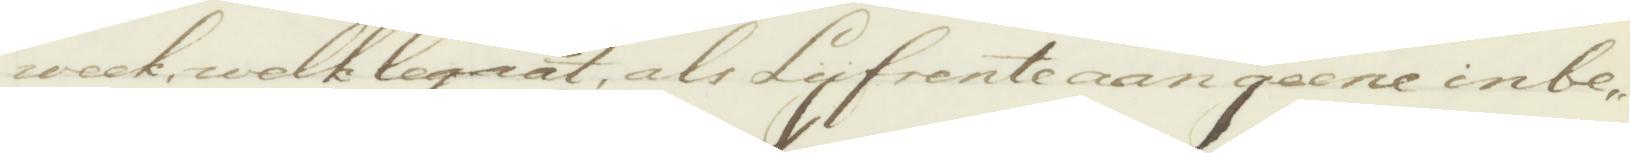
week, welk legaat, als Lijfrente aan geene inbe„
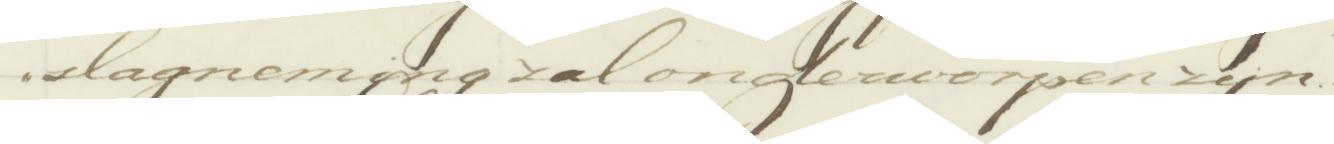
„slagneming zal onderworpen zijn.
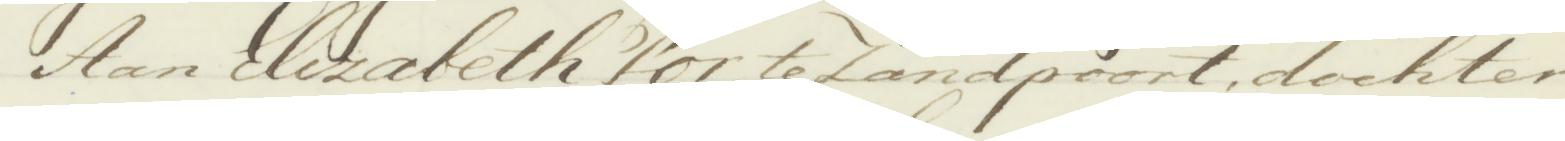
Aan Elizabeth Por, te Zandpoort, dochter
